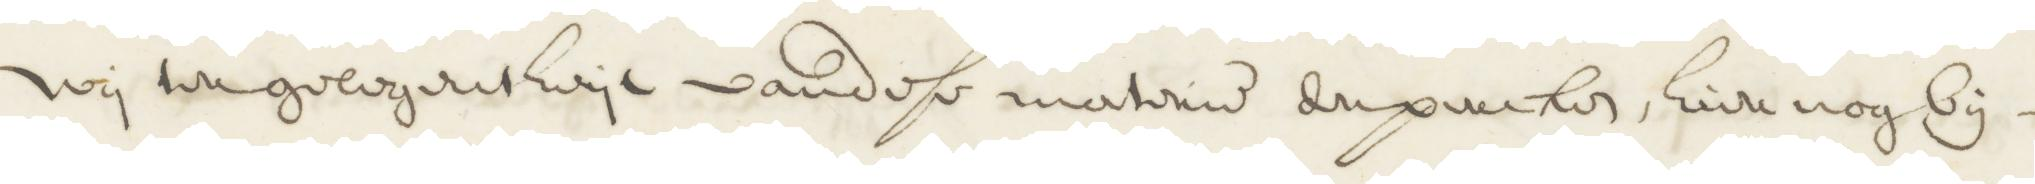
wij ter gelegentheijt vandese materie der perken, hier nog bij
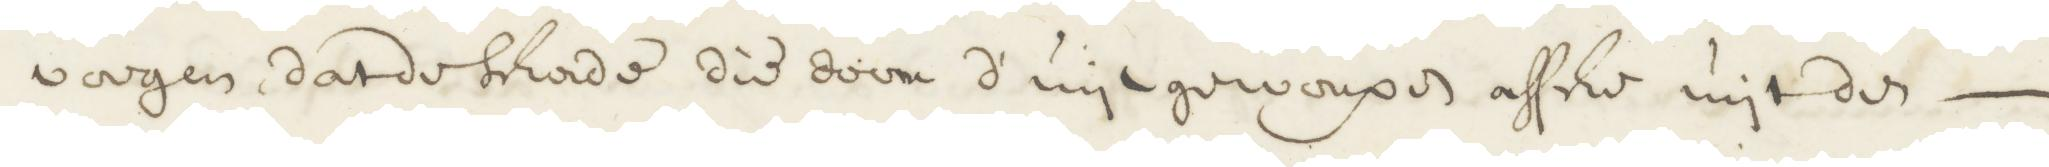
voegen, dat de schade die door d’ uijt geworpen assche uijt den —
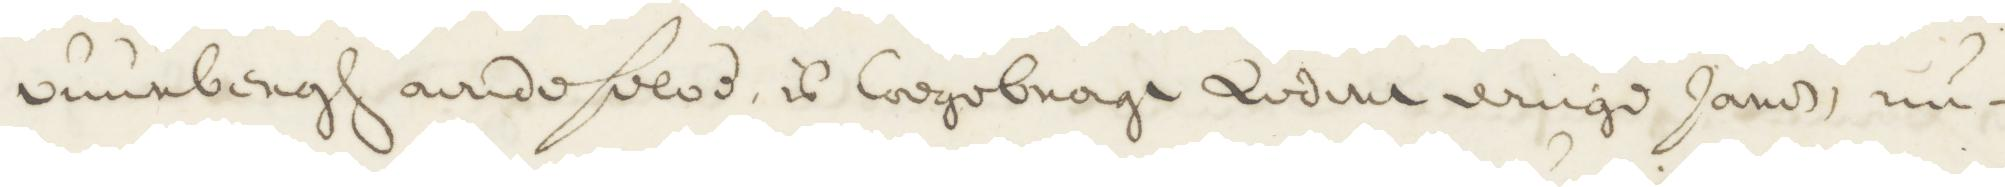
vuurbergh aen deselve, is toegebragt zedert eenige jaren, nu
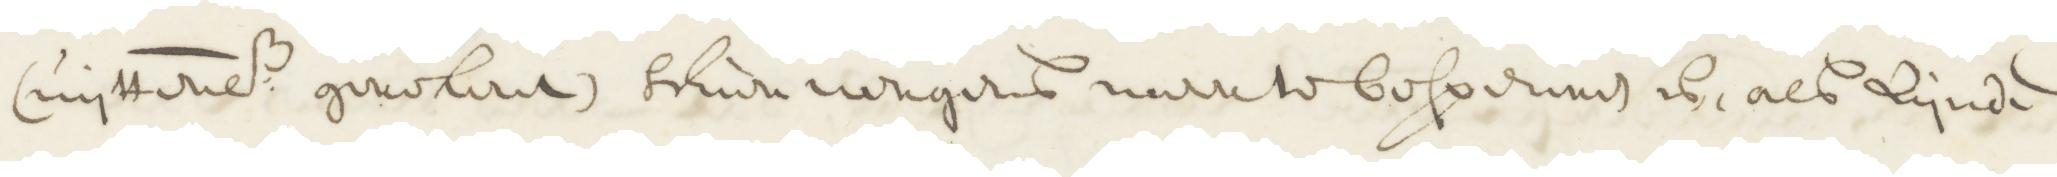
(uijtterlijk gerekent) schier nergens meer te bespeuren is, als zijnde
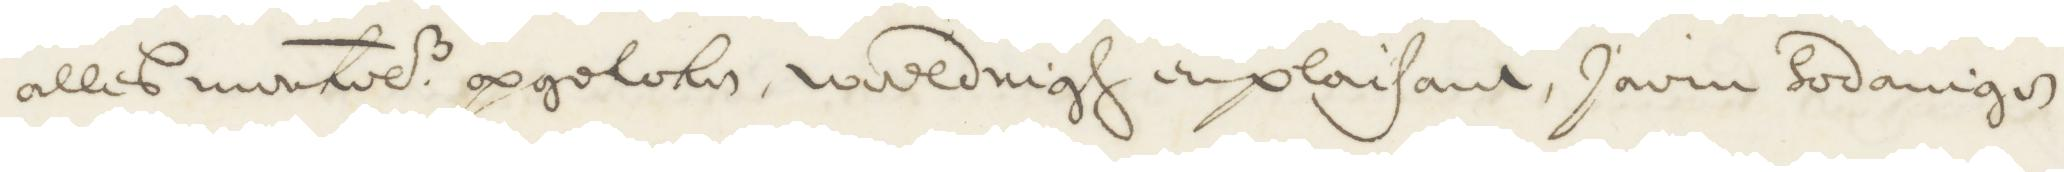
alles merkelijk opgeloken, weeldrigh en plaisant, jae in sodanigen
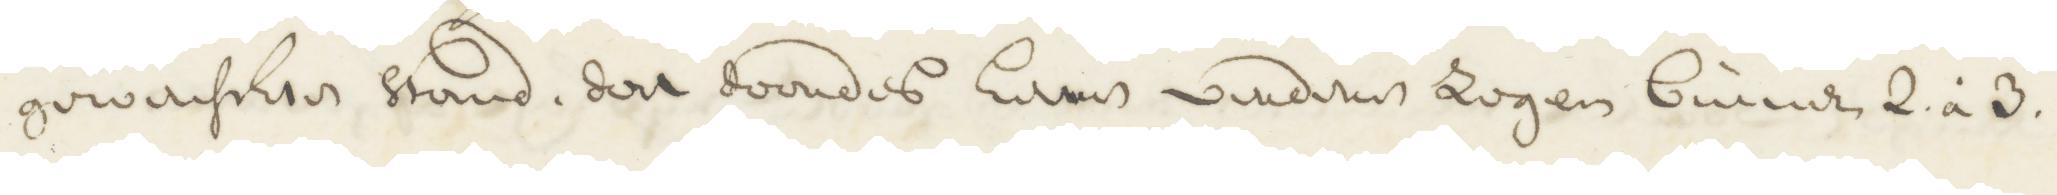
gewenschten stand, dat doordes heeren verderen zegen binnen 2. â 3.
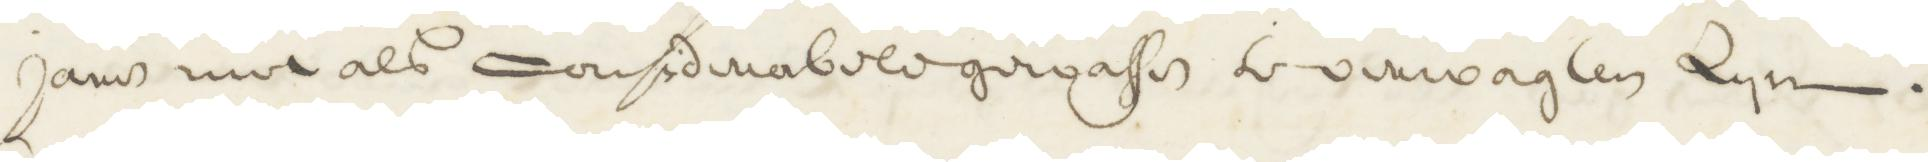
jaren niet als considirabele gewassen te verwagten zyn
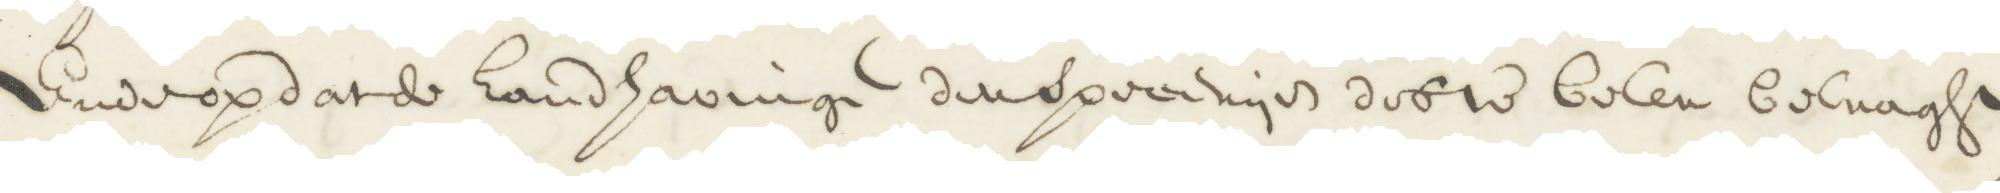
Ende op dat de handhavinge der specerijen des te beter betraght
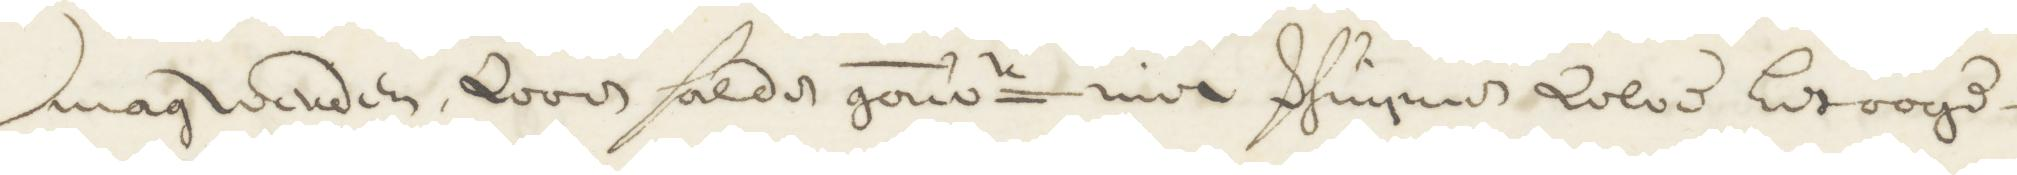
mag werden, zoo en sal den gouv=r niet versuijmen zelve het ooge
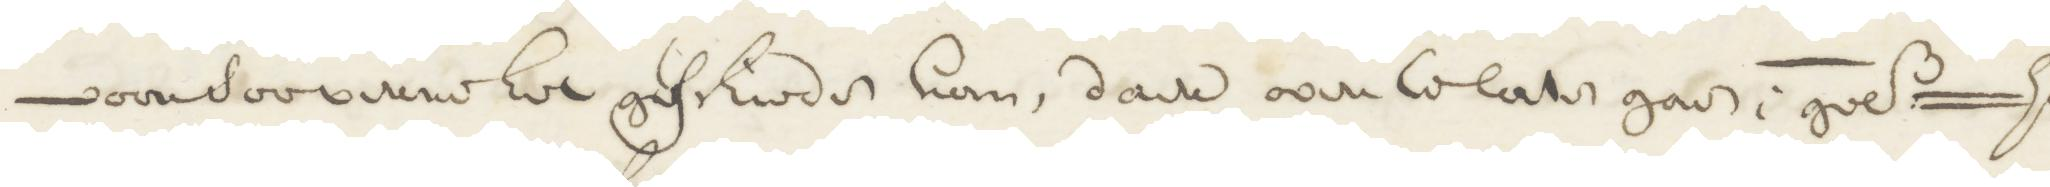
voorsooverre het geschieden kon, daer over te laten gaen; gelijk= hij
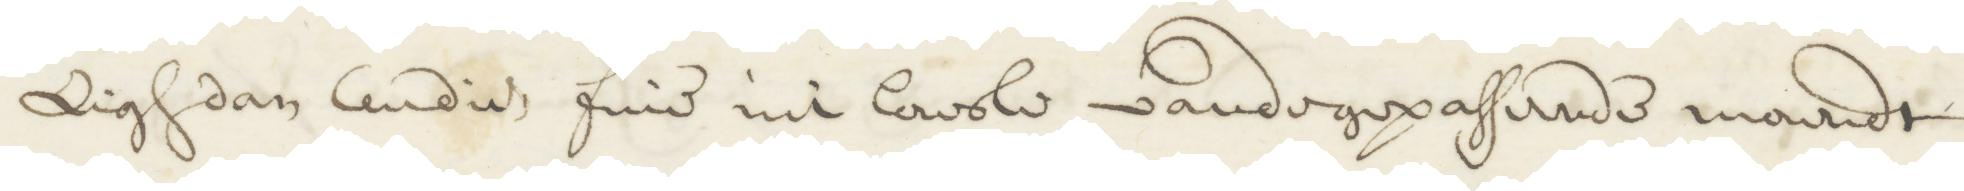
zigh dan ten dien fine in't laeste vande gepasseerde maendt
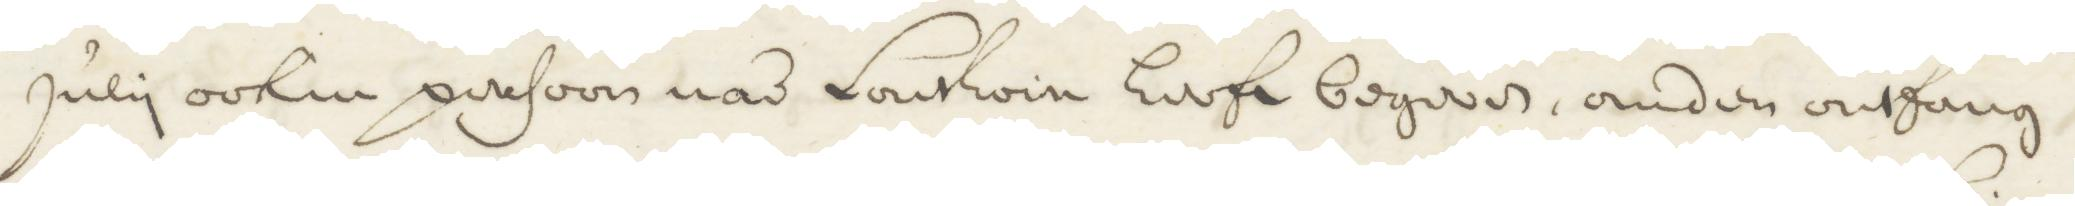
julij ook in persoon nae Lonthoir heeft begeven, om den ontfang
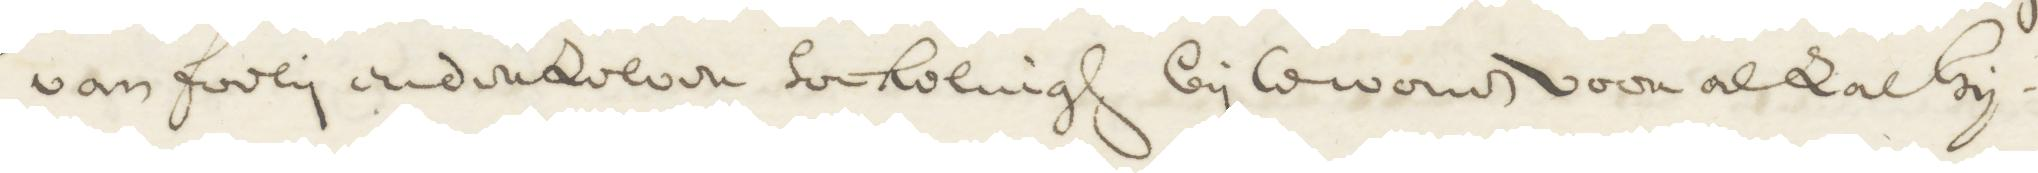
van foelij en derzelver soekelingh bij te wonen voor al zal hij
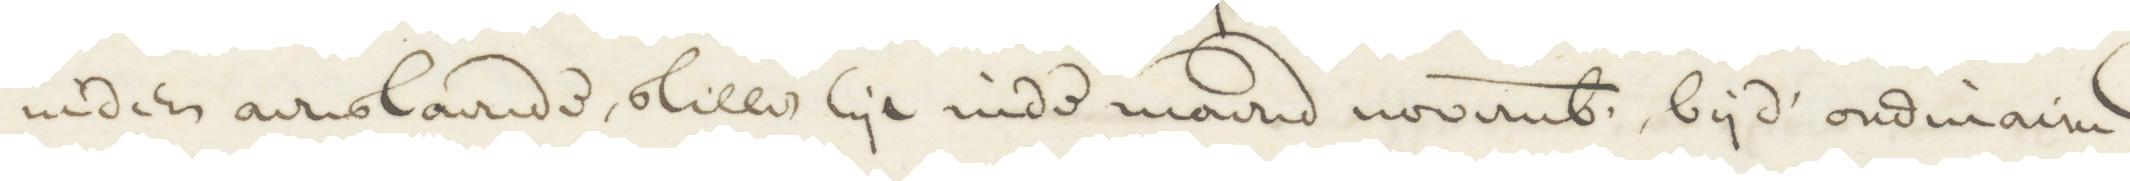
in den aenstaende, stillen tijt inde maend novemb:, bij d’ ordinaire
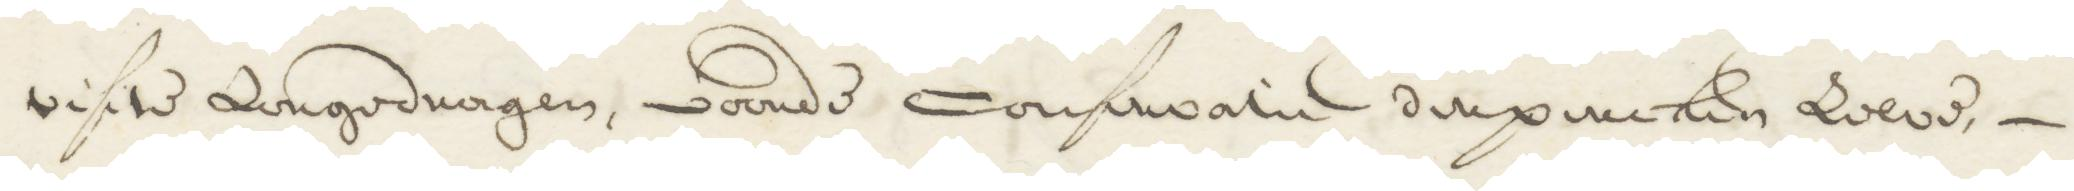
visite zorgedragen, voorde conservatie derpercken zelve, —
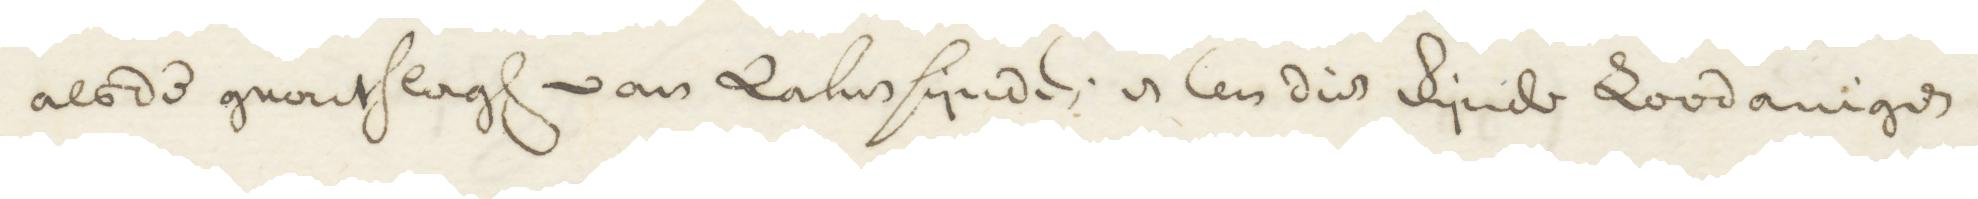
als de grontslagh van zaken sijnde; en ten die Eijnde zoodanigen —
